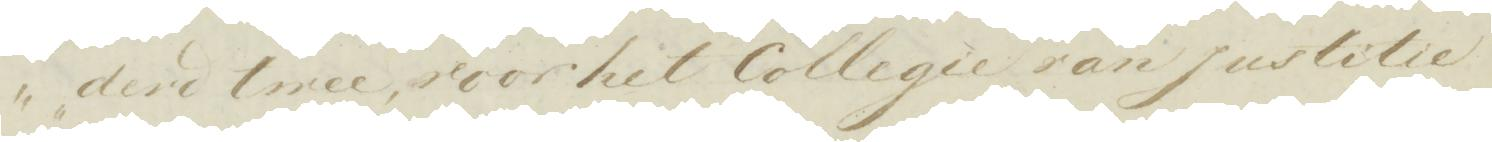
„ „derd twee, voor het Collegie van Justitie
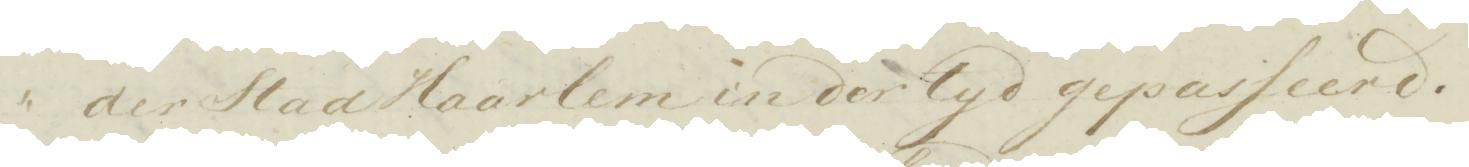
„ der Stad Haarlem in der tyd gepasseerd.
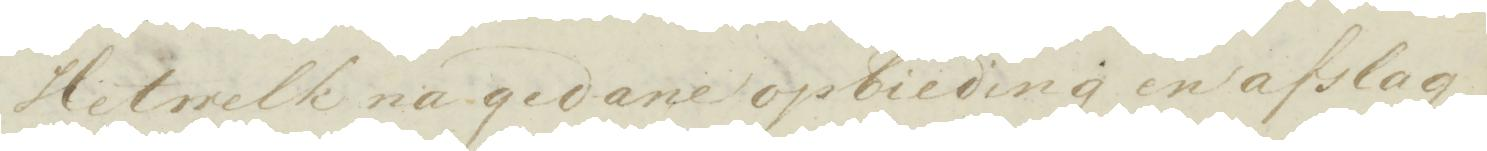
Hetwelk na gedane opbieding en afslag
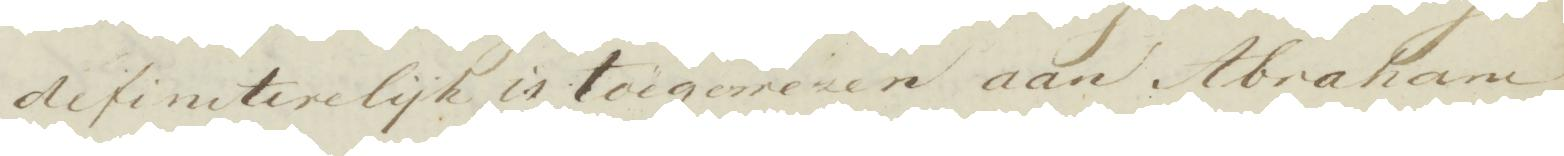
definitivelijk is toegewezen aan Abraham
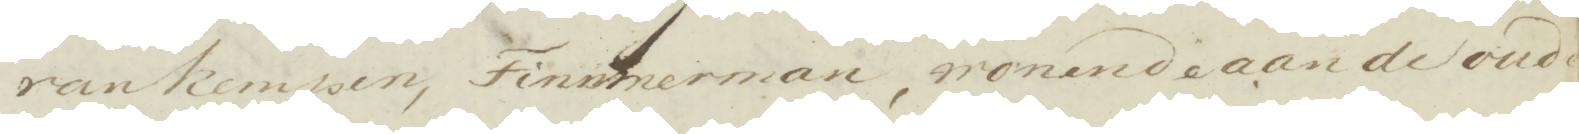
van kempen, Tinnmerman, wonende aan de oude
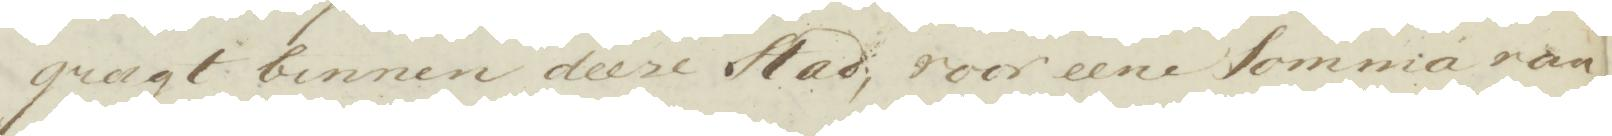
gragt binnen deeze stad, voor eene Somma van
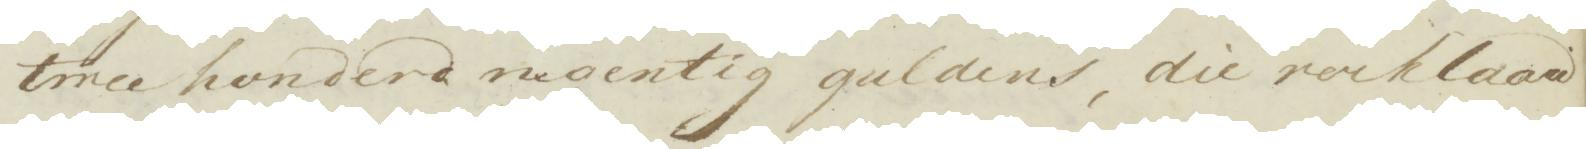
twee honderd negentig guldens, die verklaard
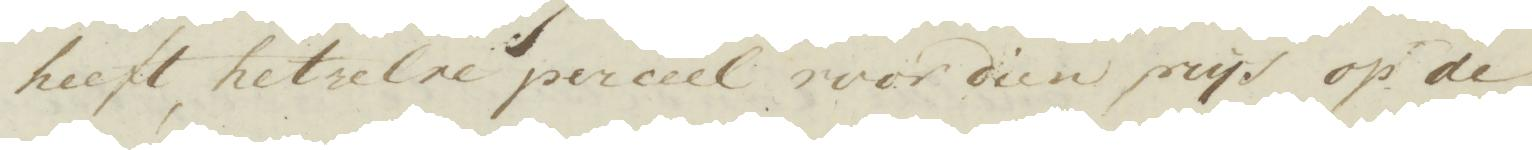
heeft, hetzelve perceel voor dien prijs op de
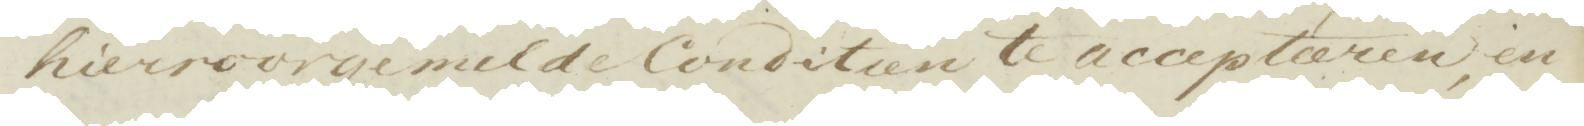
hiervoorgemelde Conditien te accepteeren, en
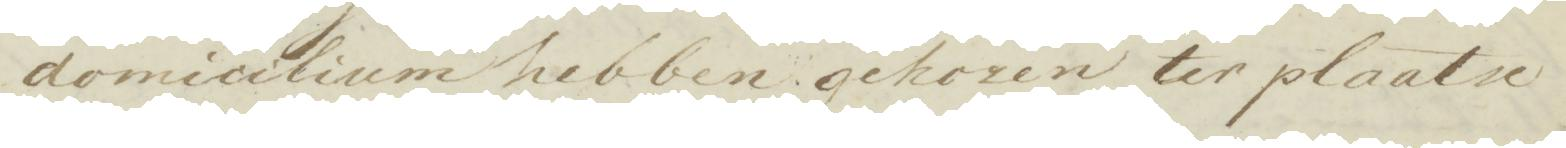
domicilium hebben gehoren ter plaatse
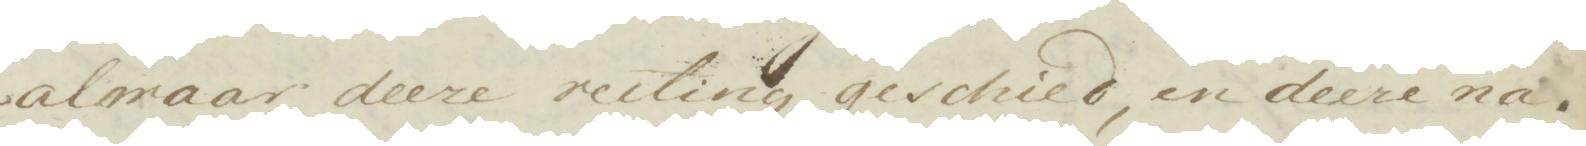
alwaar deeze veiling geschied, en deeze na„
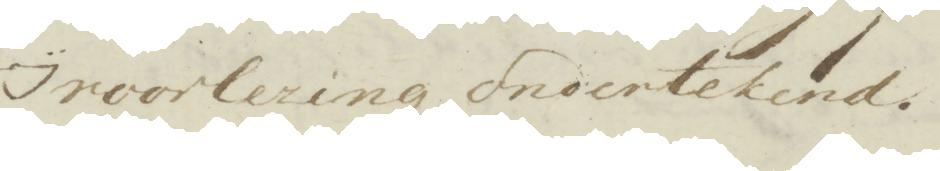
voorlezing ondertekend.
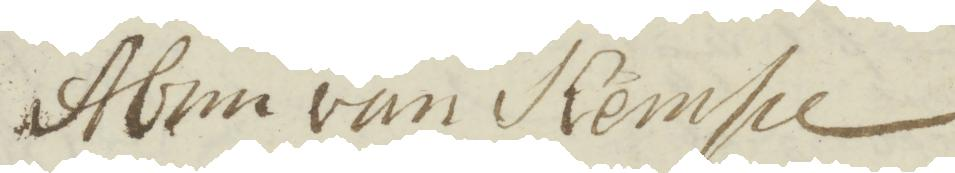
Abm van Kempe
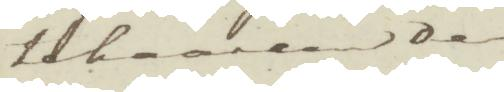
tehaarlem den
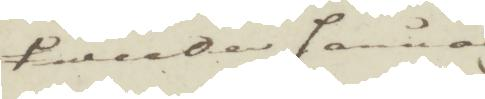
tweeden Januarij
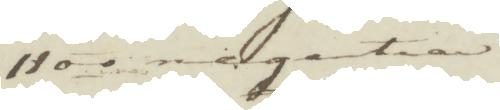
1800 negentien
